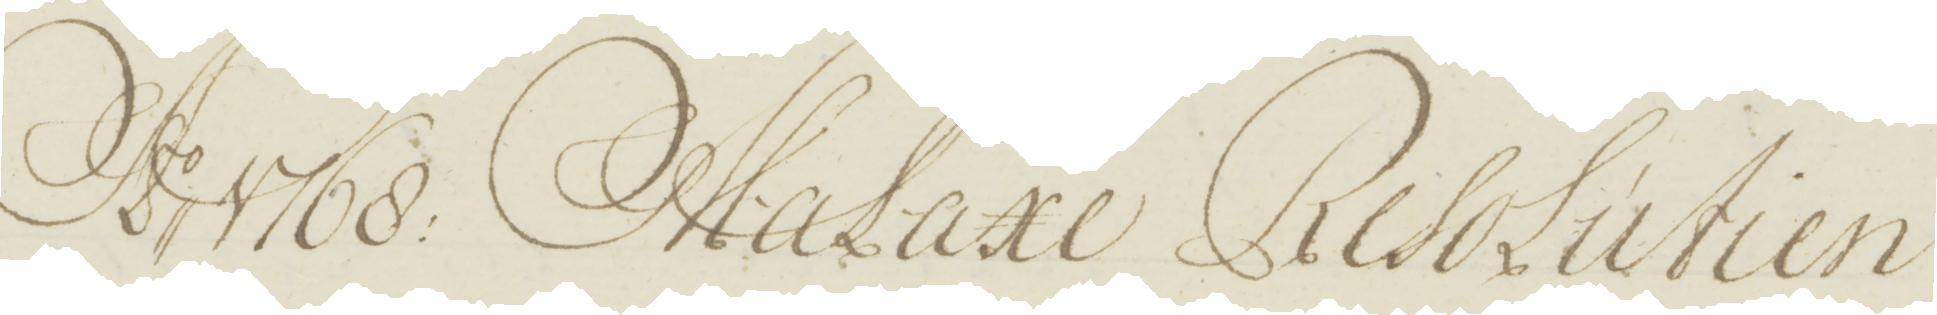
A„o 1768: Malaxe Resolutien
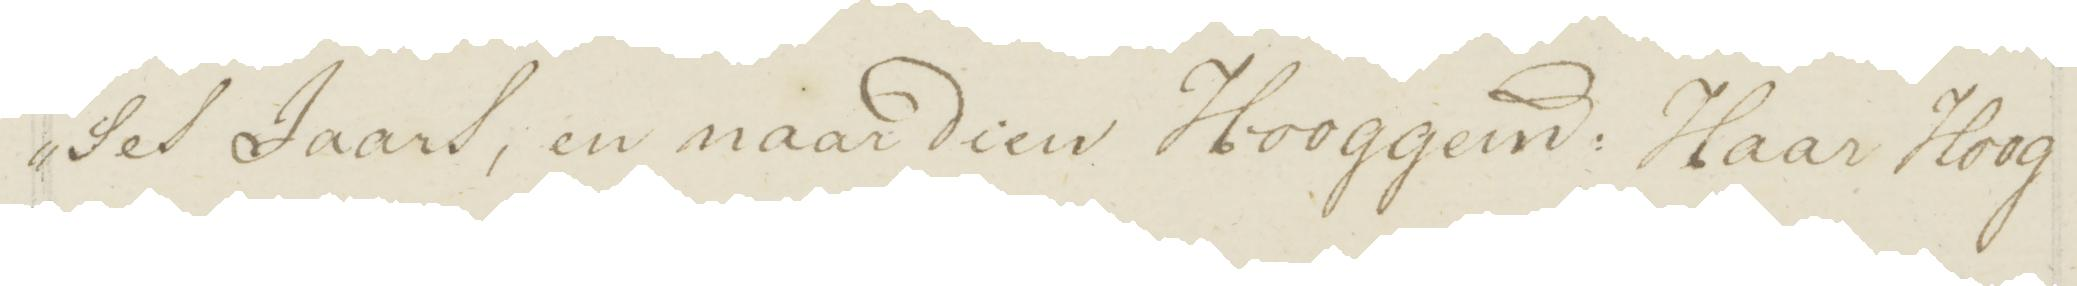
„ses Jaars, en naar dien Hooggem: Haar Hoog
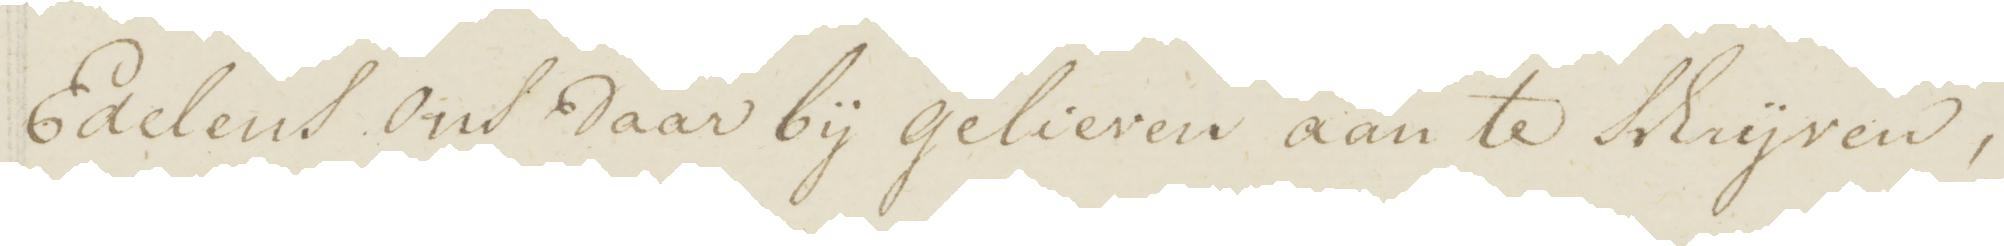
Edelens ons daar bij gelieven aan te schrijven,
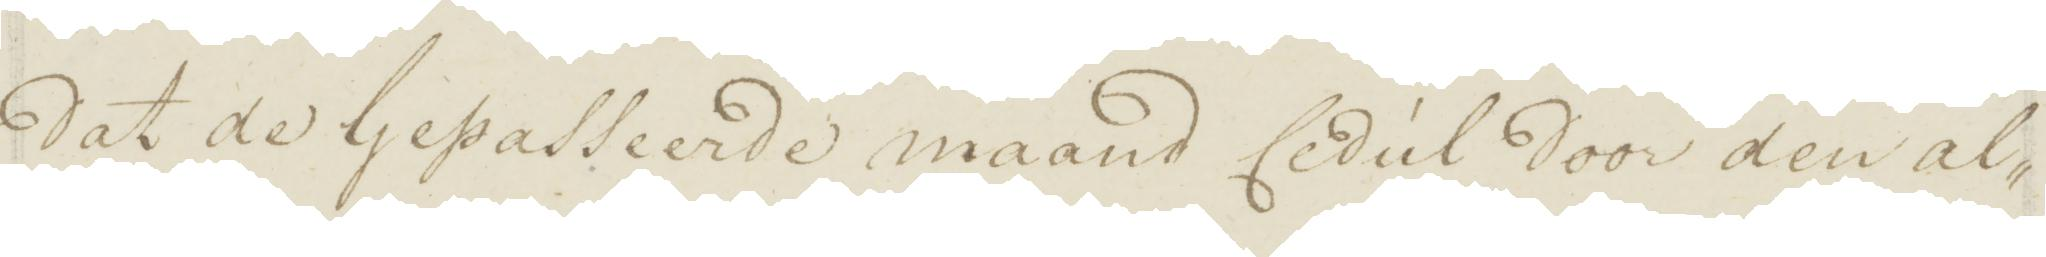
dat de Gepasseerde maand cedul door den al„
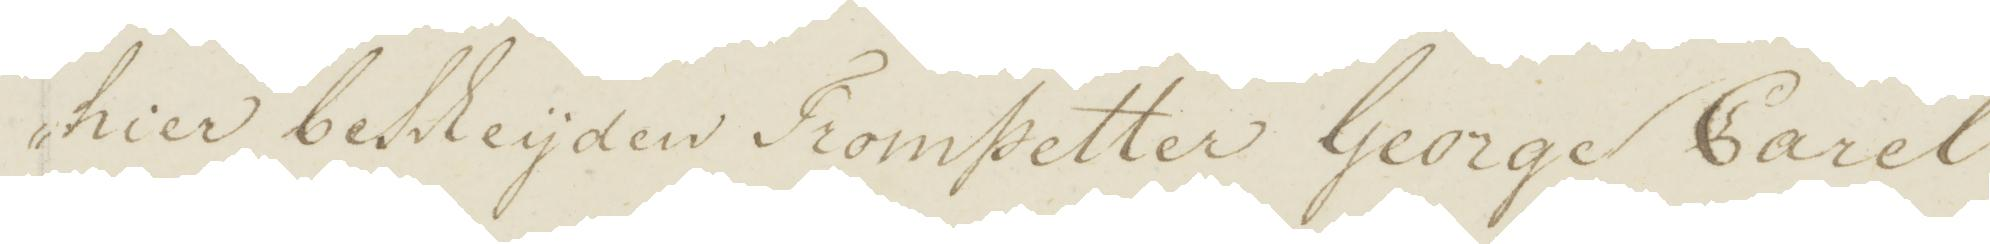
„hier bescheijden Trompetter George Carel
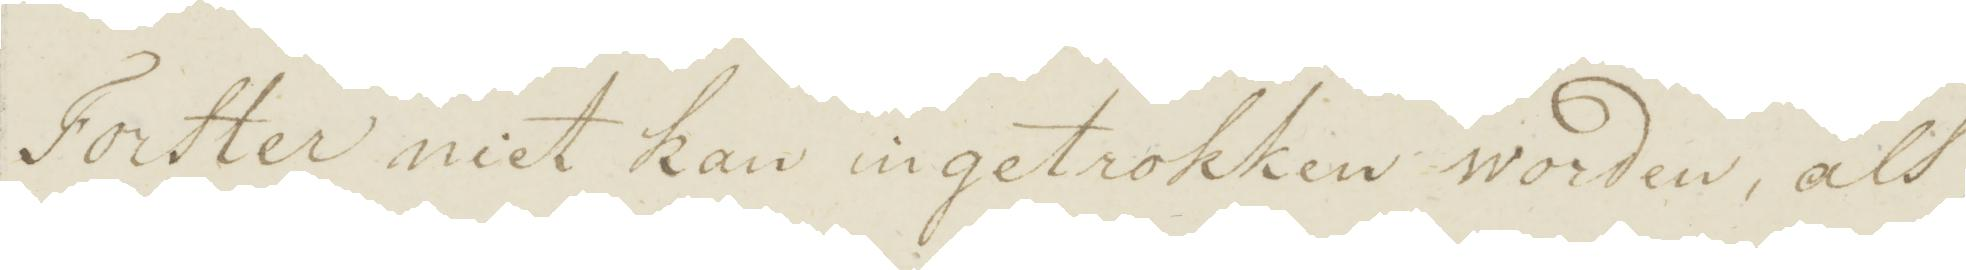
Forster niet kan ingetrokken worden, als
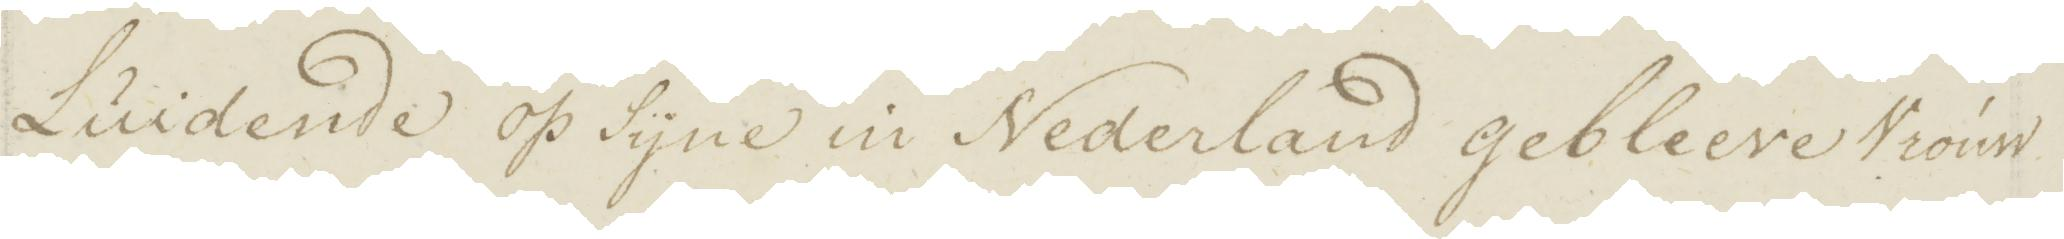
Luidende op sijne in Nederland gebleeve vrouw
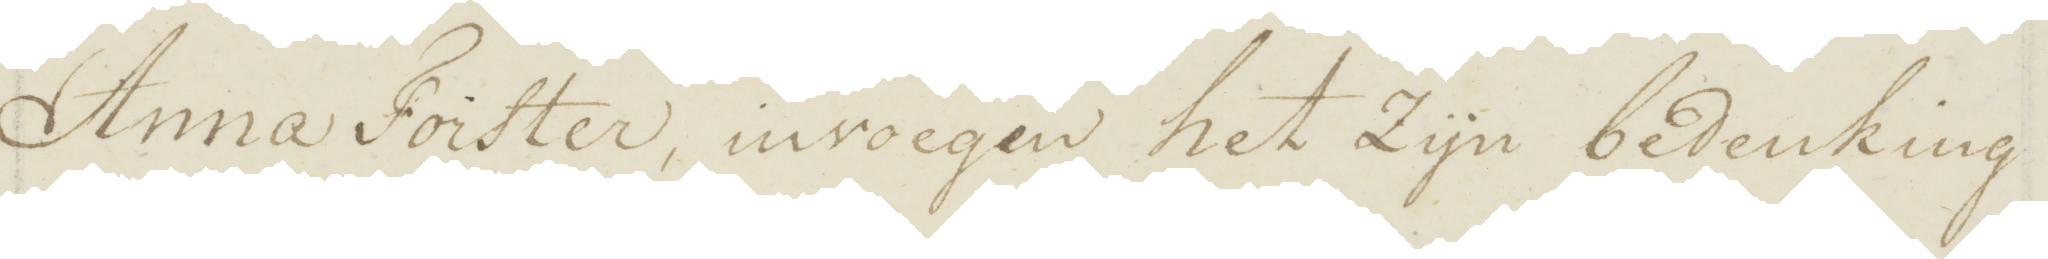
Anna Forster, invoegen het zijn bedenking
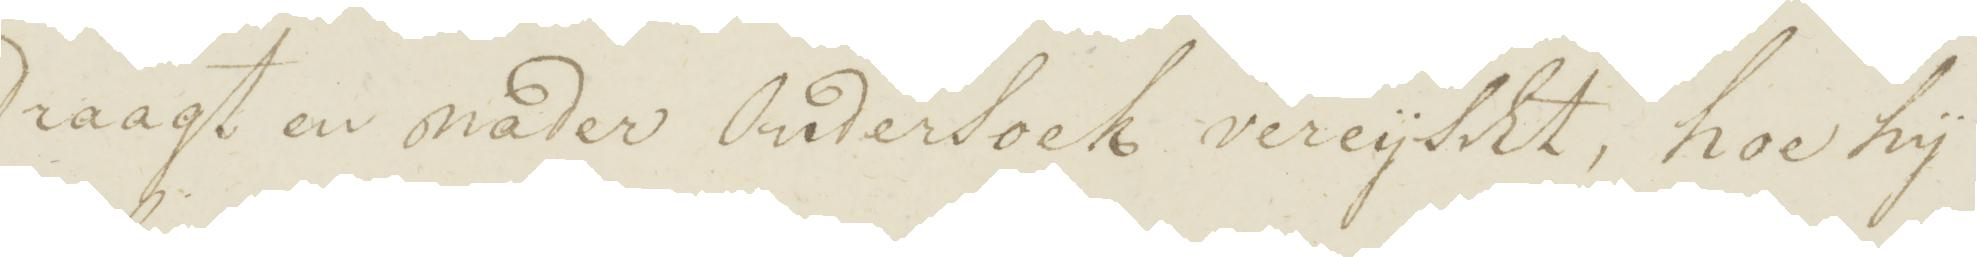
draagt en nader Ondersoek vereijscht, hoe hij
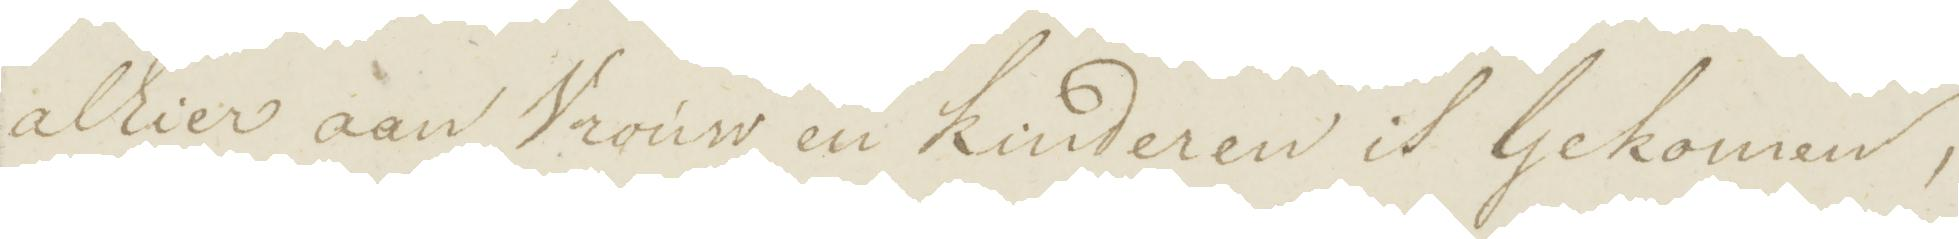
alhier aan Vrouw en kinderen is Gekomen
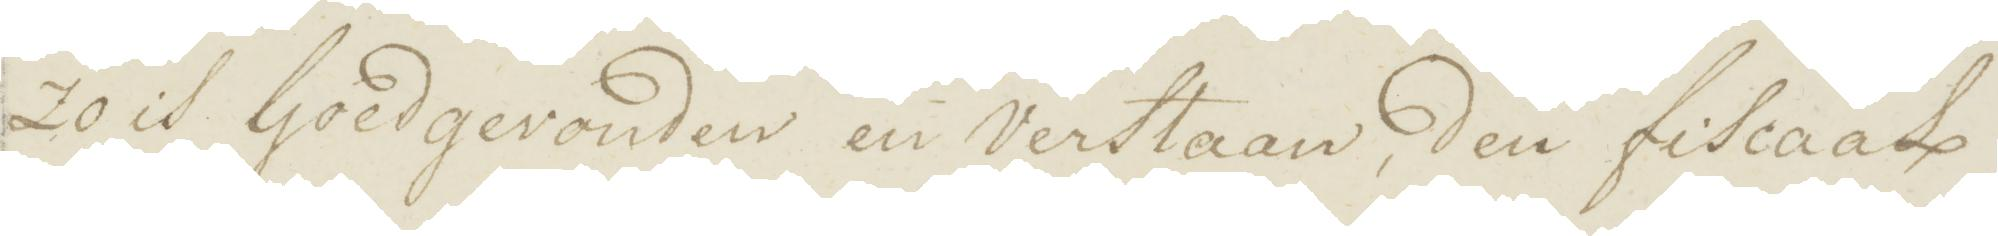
zo is Goedgevonden en verstaan, den fiscaal
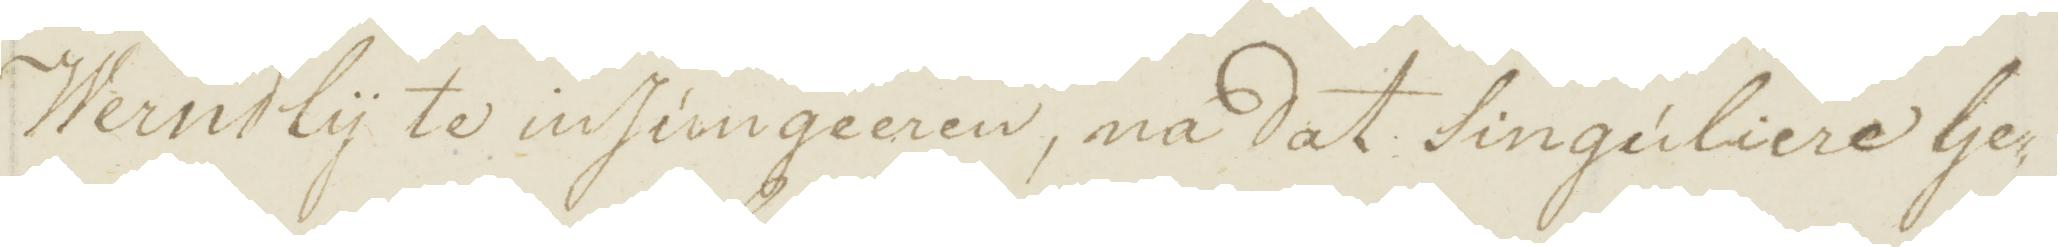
Werndlij te injungeeren, na dat singuliere Ge„
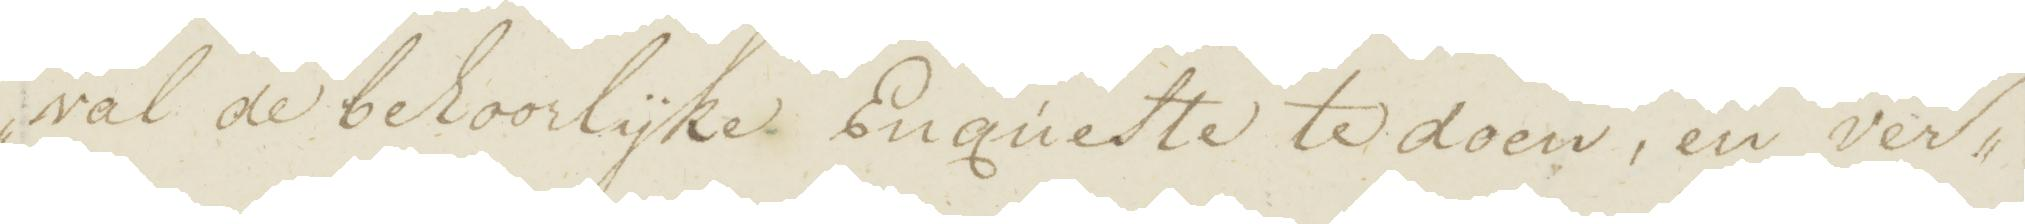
val de behoorlijke Enqueste te doen, en ver„
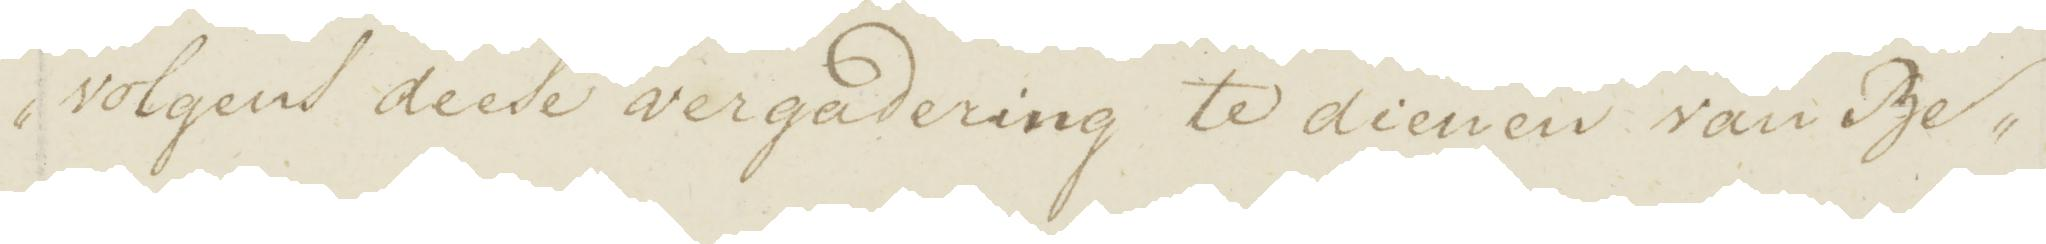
„volgens deese vergadering te dienen van Be„
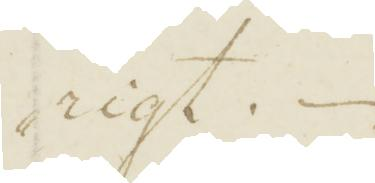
rigt.-
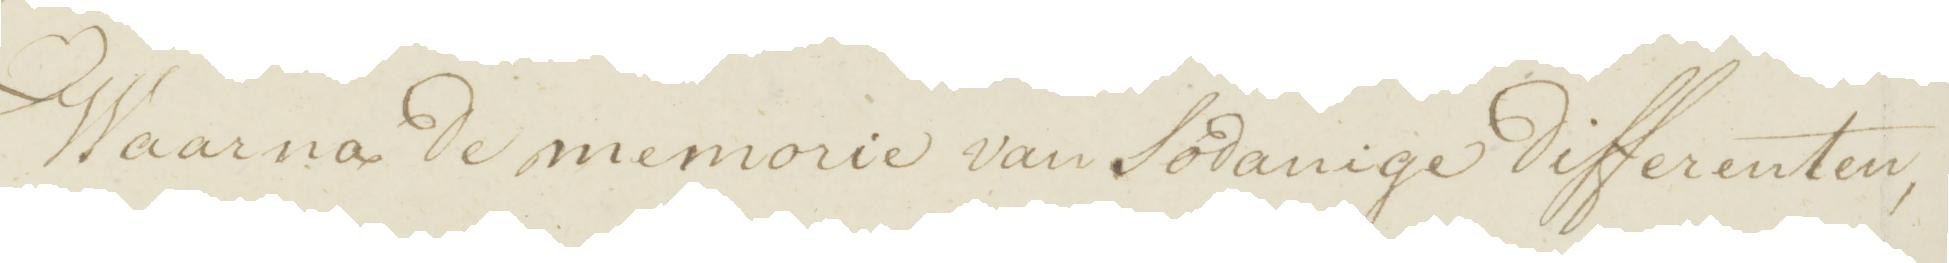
Waarna de memorie van sodanige differenten,
